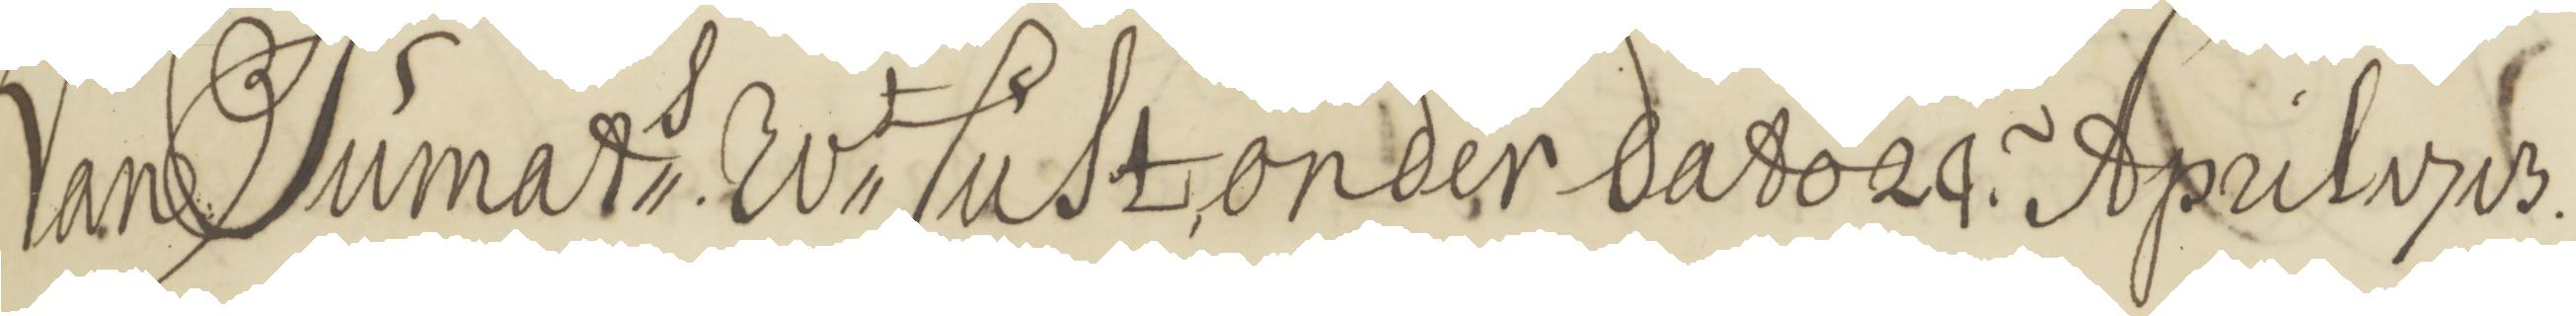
Van Sumat„s W„t Cust, onder dato 24.' April 1713.
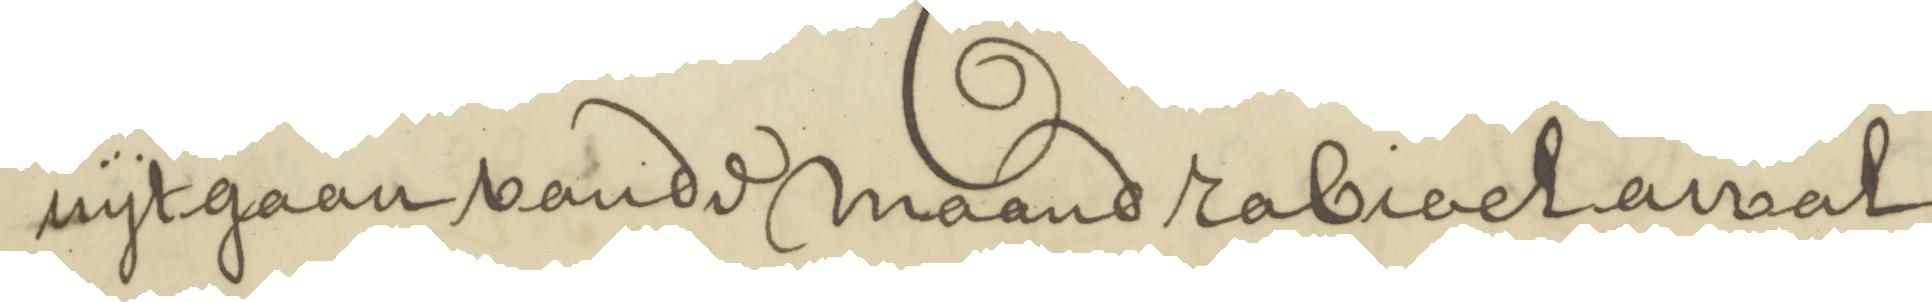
uijtgaan van de maand rabioelawal
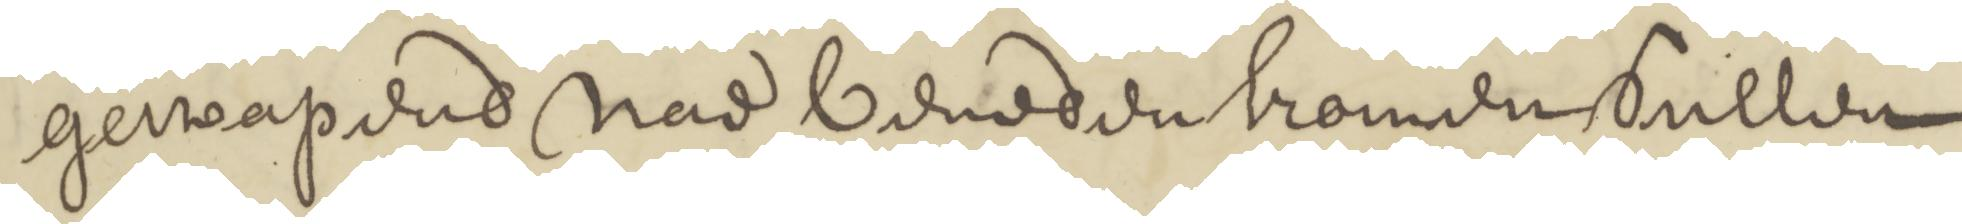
gewapend nae beneden komen sullen
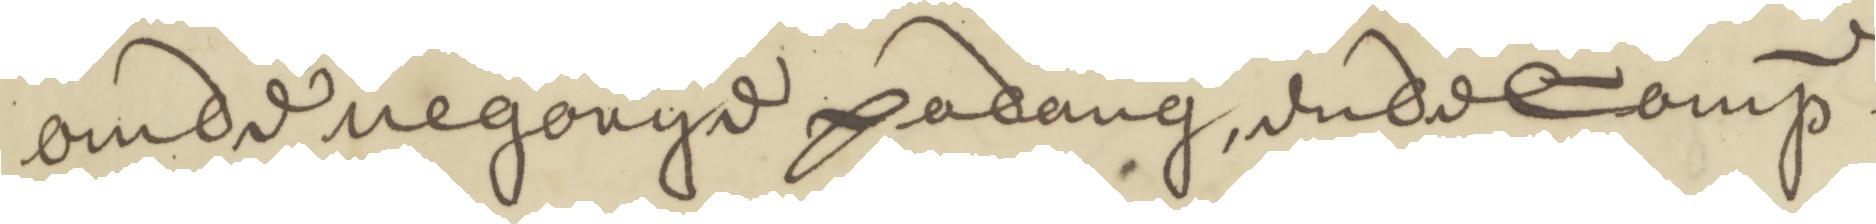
om de negorije padang, ende Comp.
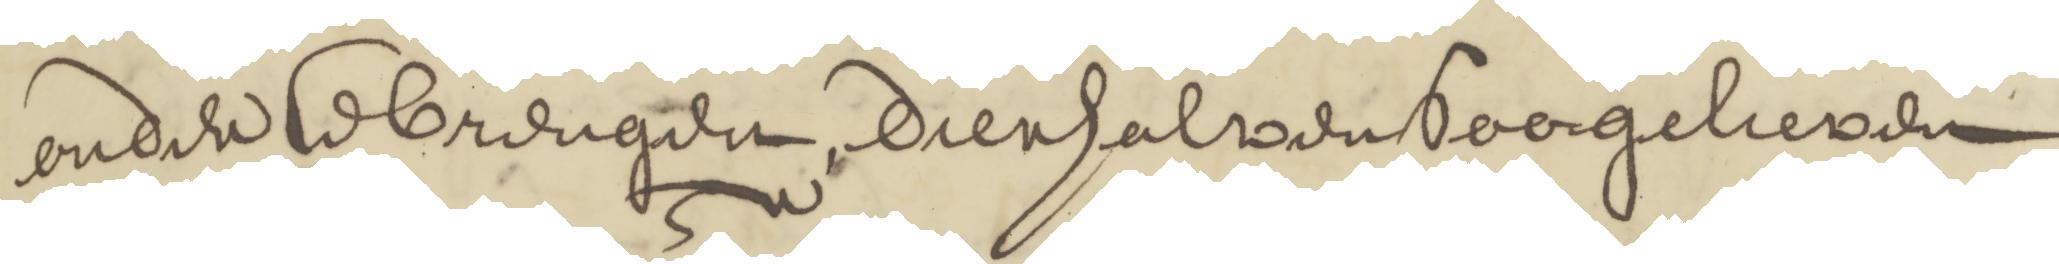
onder te brengen, dierhalven soo gelieven
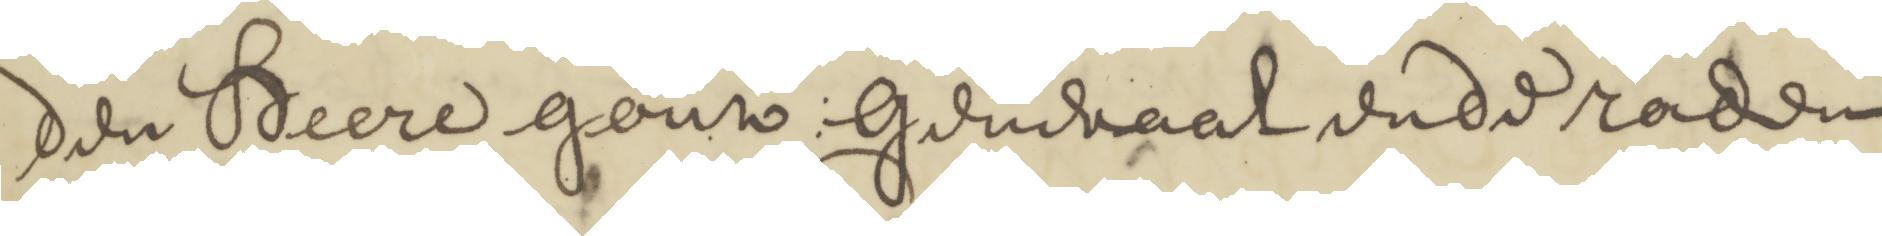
den Heere gouv:r generaal ende raden
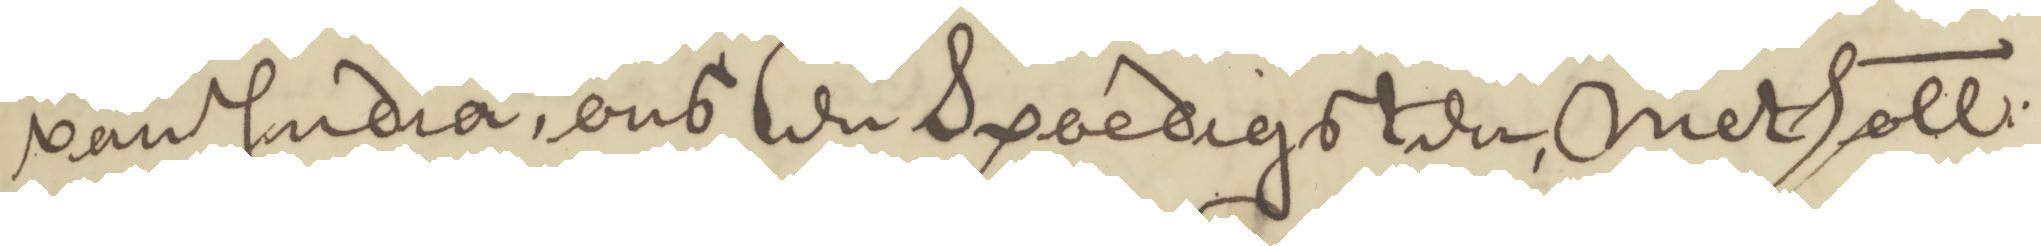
van Jndia, ons ten spoedigsten met holl:
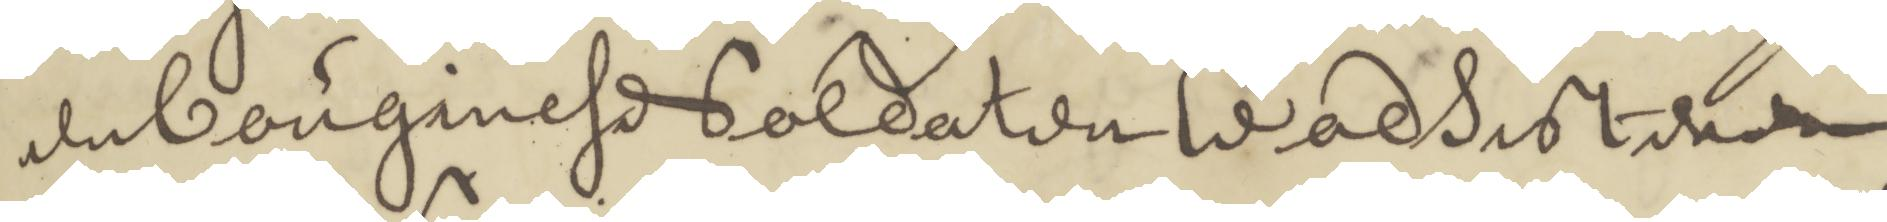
en bouginese soldaten te adsisteren
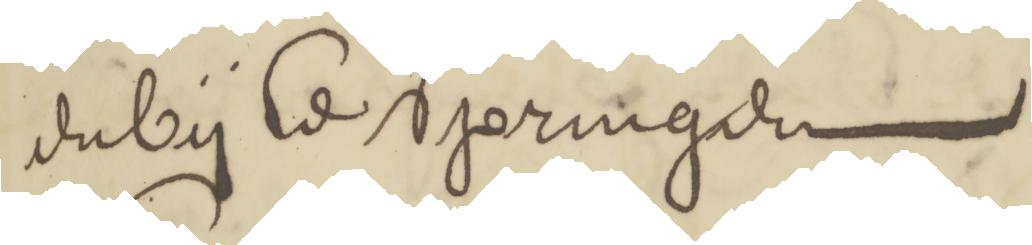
en bij te springen.
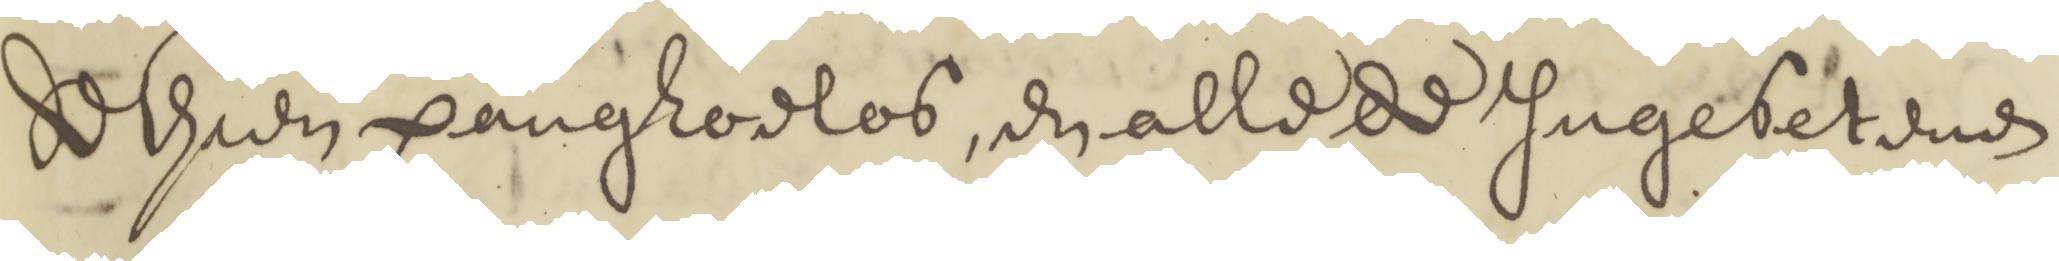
de thien panghoelos, en alle de Jngesetenen
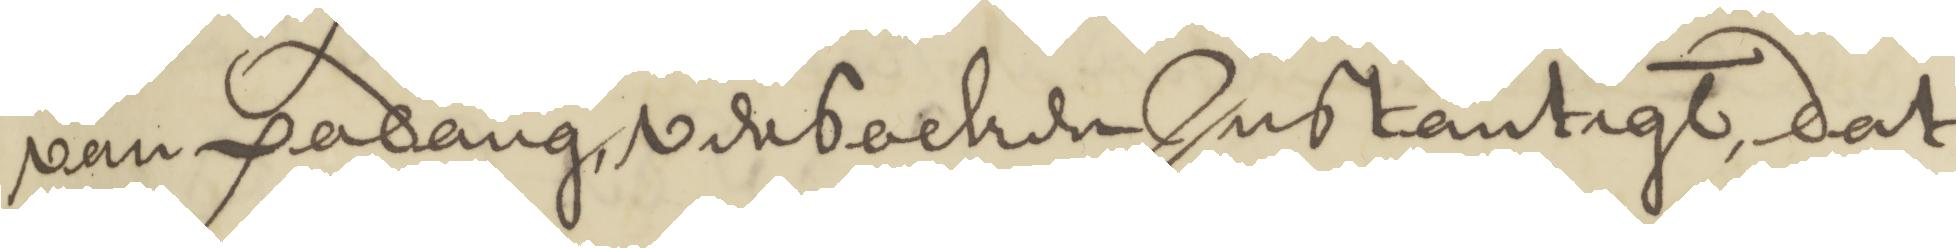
van padang, versoeken Jnstantigl, dat
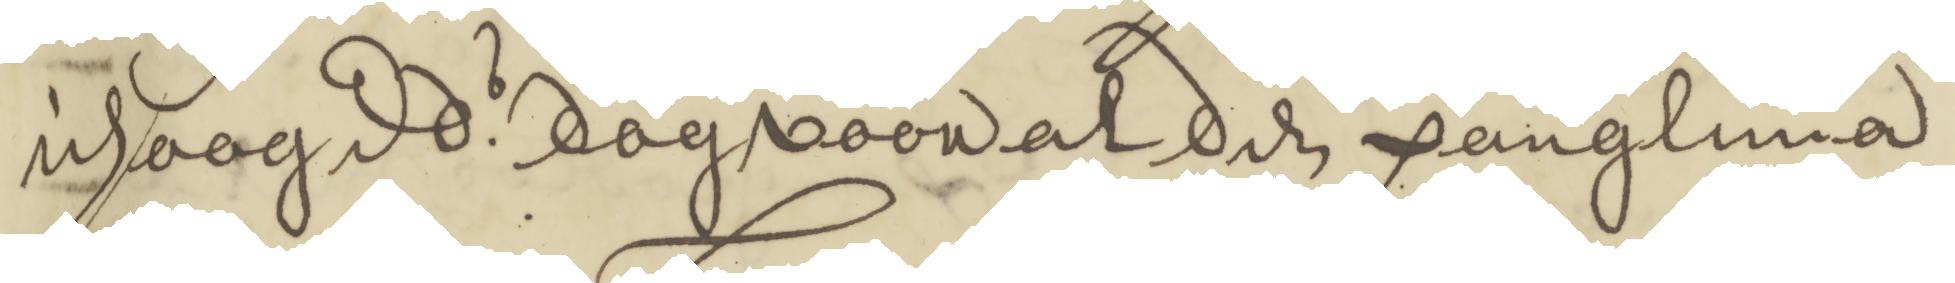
uhoog Ed: dag voor al den panglima
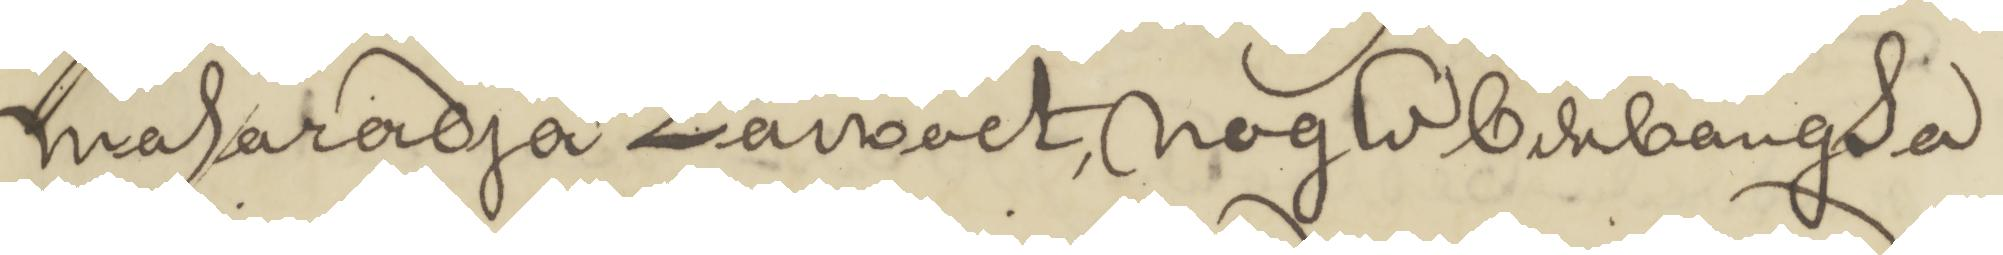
maharadja Lawoet, nog te berbangsa
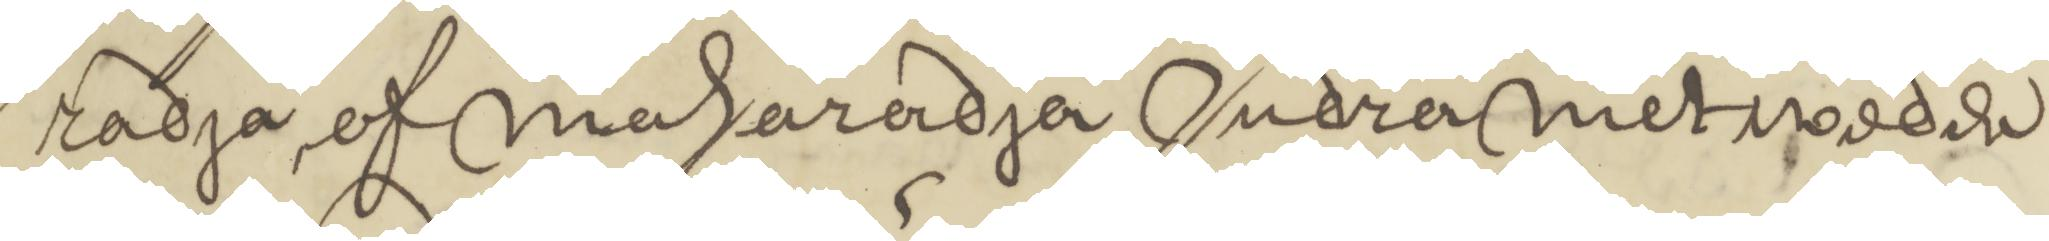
radja of maharadja Jndra niet weder
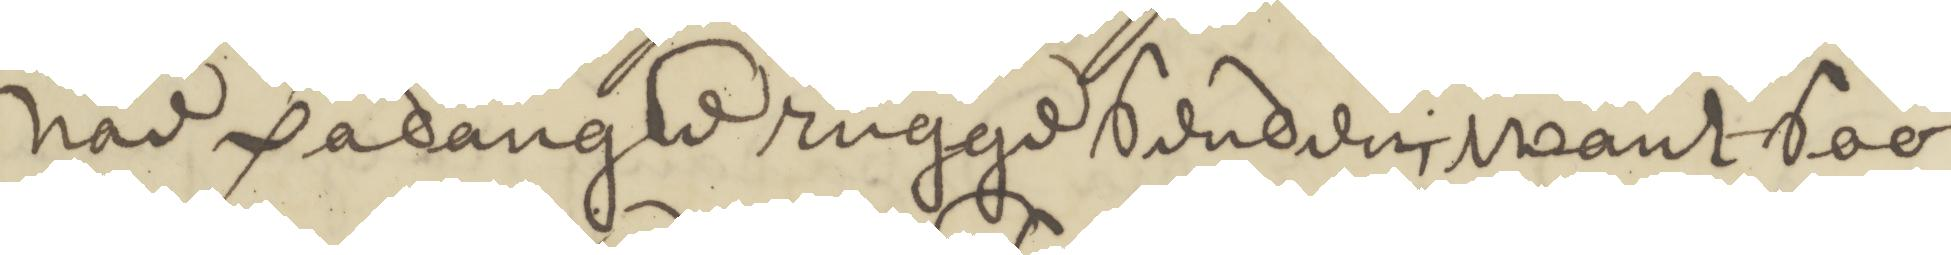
nae padang terugge senden, want soo
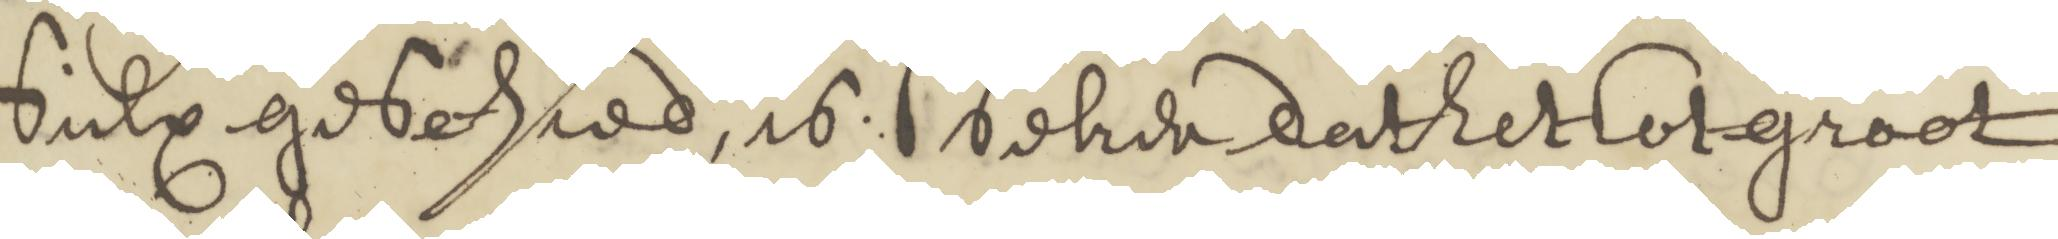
sulx geschied, is t seker dat het tot groot
